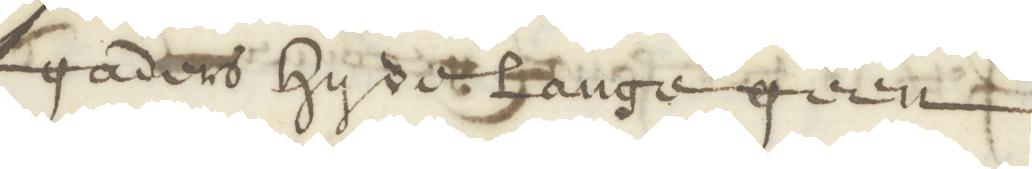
gaders hij de Lange geen
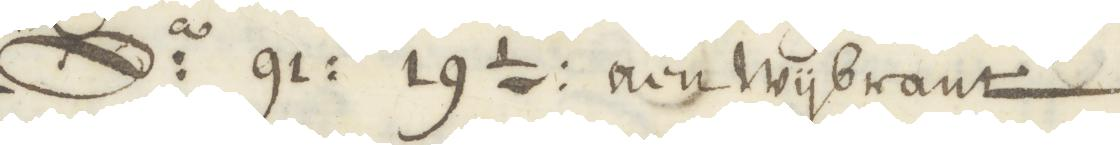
R:a 91: 19½: aen wijbrant
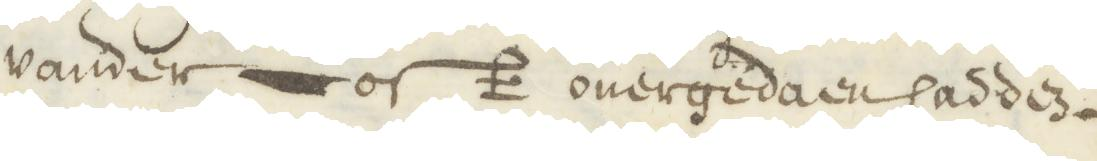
vander cost overgedaen hadden
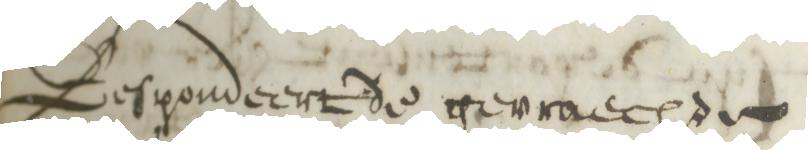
Despondeert de gevraechde
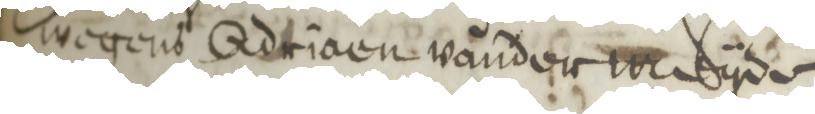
wegens Adriaen vander Meijde
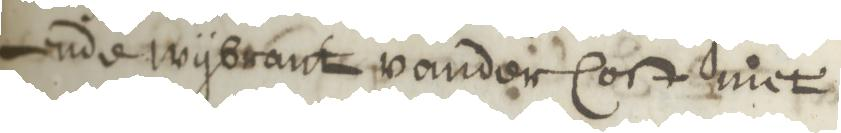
ende wijbrant vander Cost niet
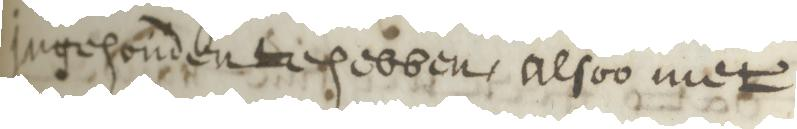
ingehouden te hebben, alsoo met
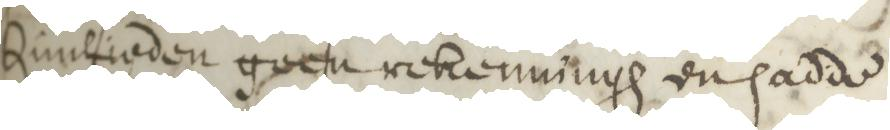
hunlieden geen rekenningh en hadde
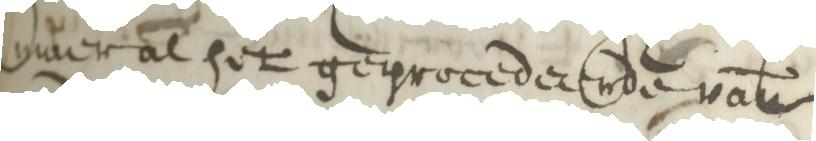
maer al het geprocedeerde van
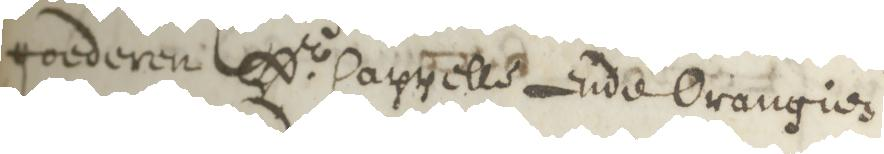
goederen p„r Cappelle ende Orangien
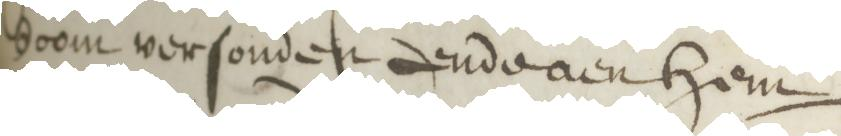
boom versonden ende aen hem
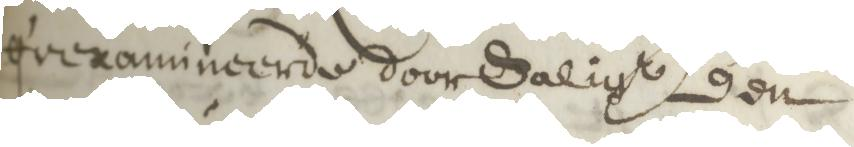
g'eexamineerde door Saligr den
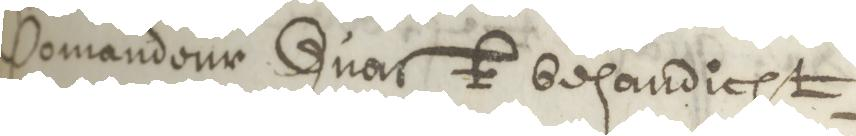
Comandeur quast behandicht
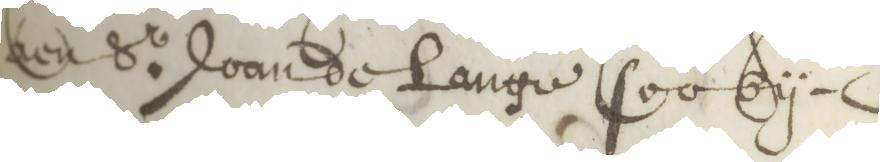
aen s„r Joan de lange soo bij —
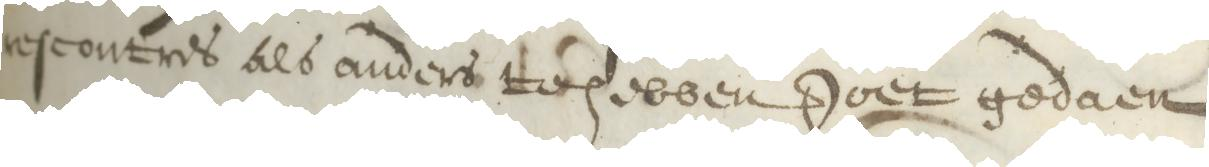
rescontres als anders te hebben goet gedaen
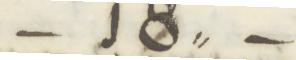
— 18„ —
